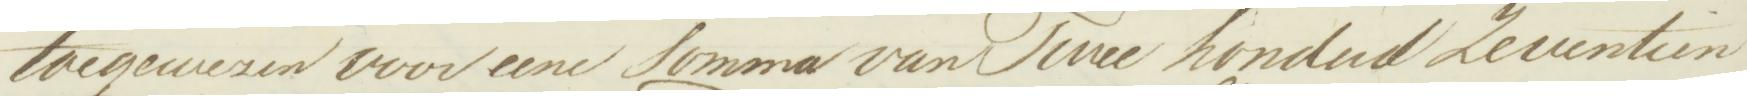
toegewezen voor eene somma van Twee honderd Zeventien
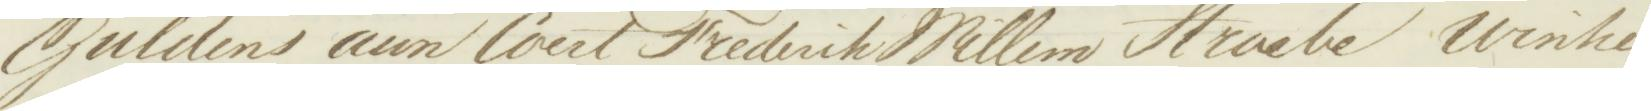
Guldens aan Coert Frederik Willem Stroebe Winke
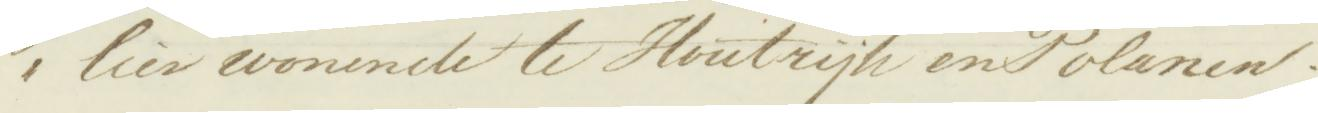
„ lier wonende te Houtrijk en Polanen
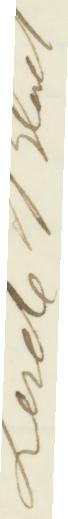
Zesde Blad
